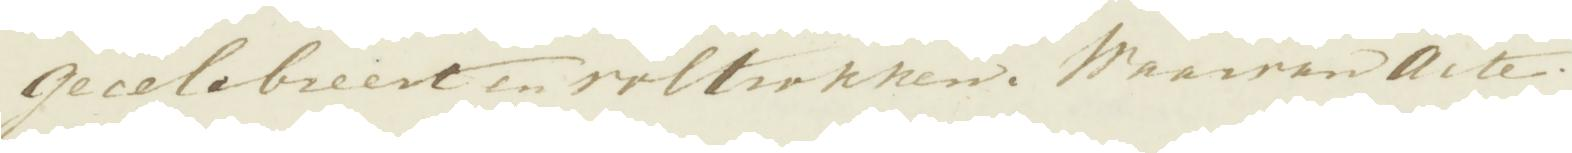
gecelabreert en voltrokken, Waarvan Acte.
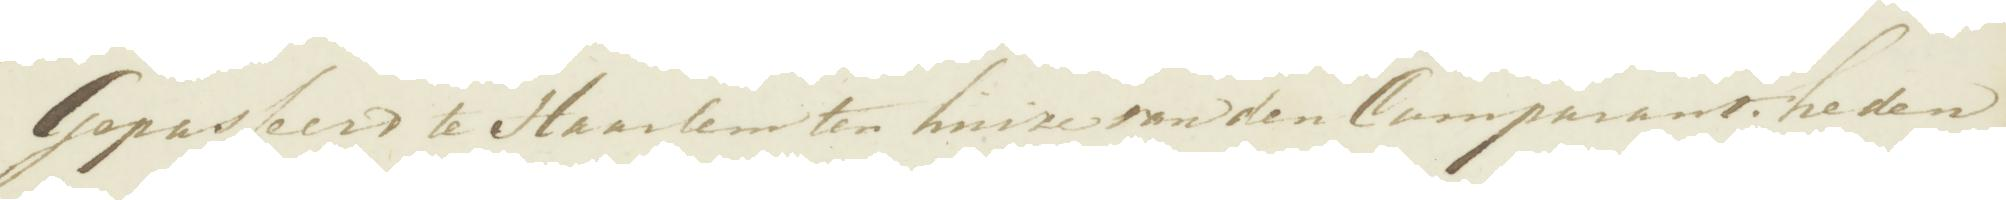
Gepasseerd te Haarlem ten huize van den Comparant, heden
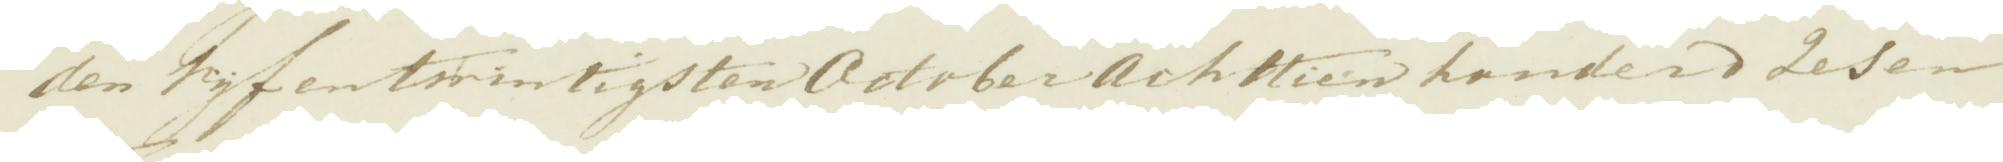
den Vijf en twintigsten October Achttien honderd zes en
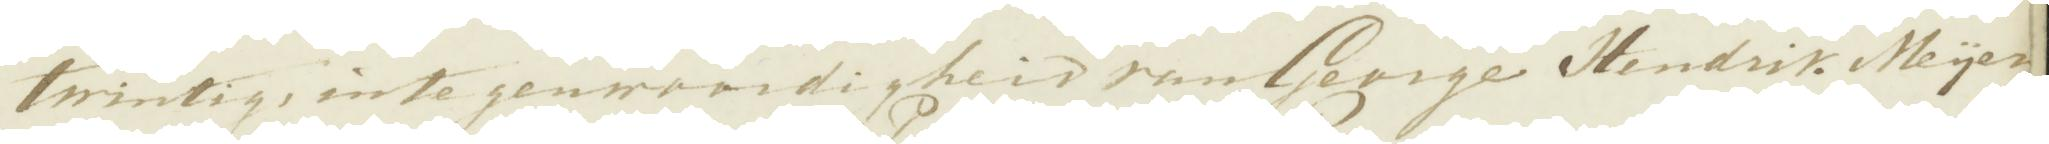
twintig, in tegenwoordigheid van George Hendrik Meijer
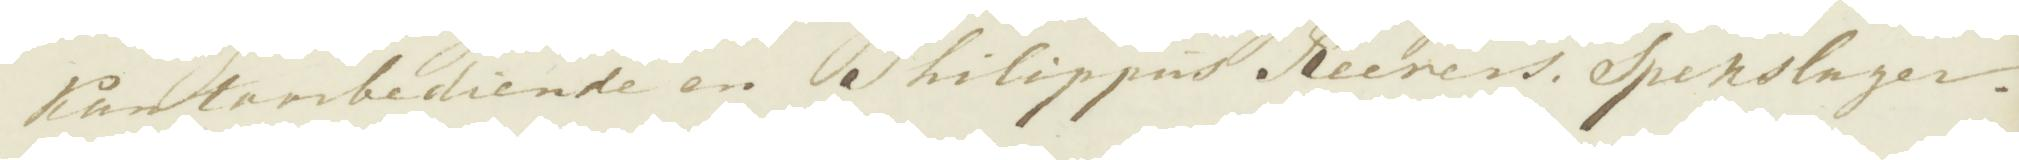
Kantoorbediende en Philippus Reevers, spekslager,
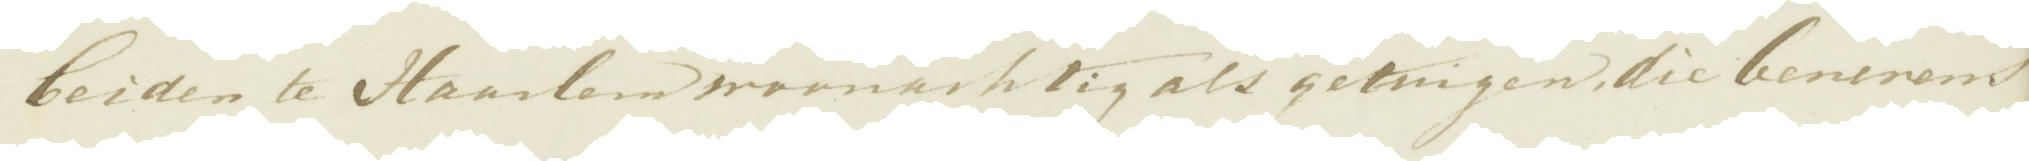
beiden te Haarlem woonachtig als getuigen, die benevens
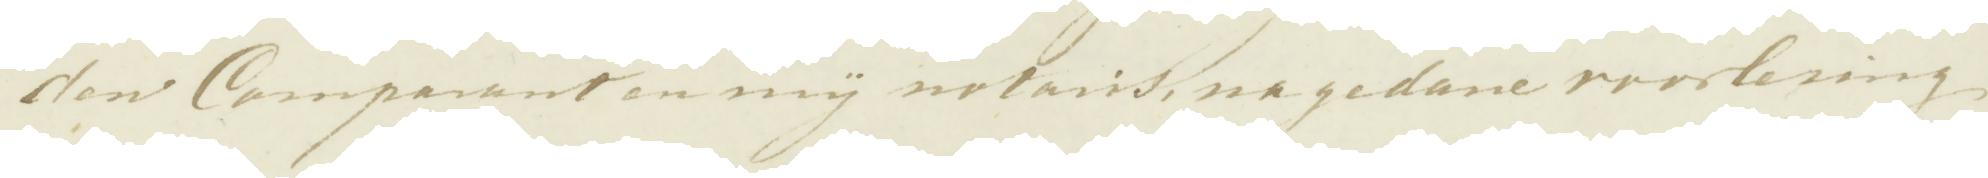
den Comparant en mij notaris, na gedane voorlezing
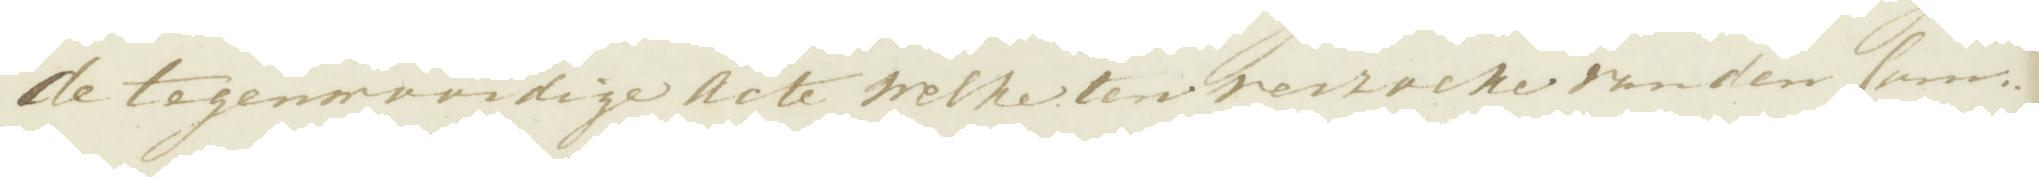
de tegenwoordige Acte welke ten verzoeke van den Com„
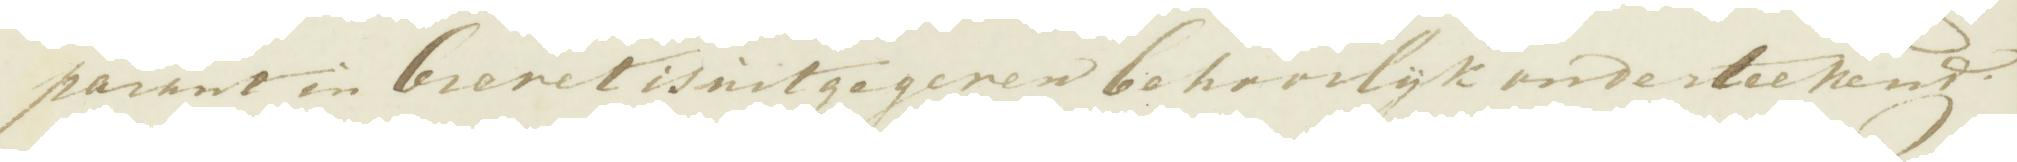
parant in brevet is uitgegeven behoorlijk onderteekend.
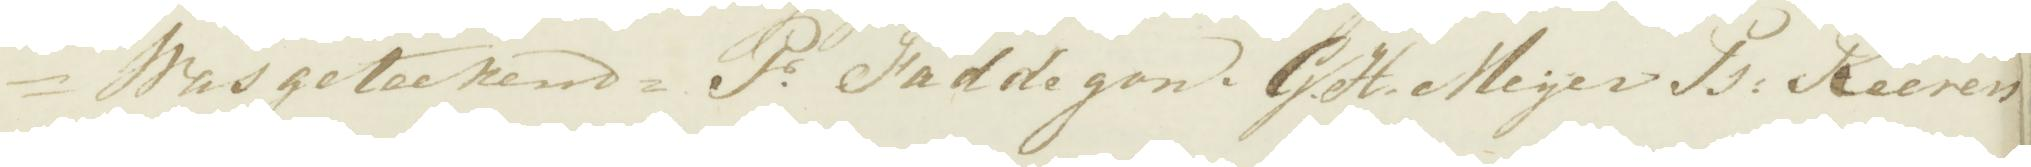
= Was geteekend = P.r Faddegon, G. H. Meijer Ps: Reevers
